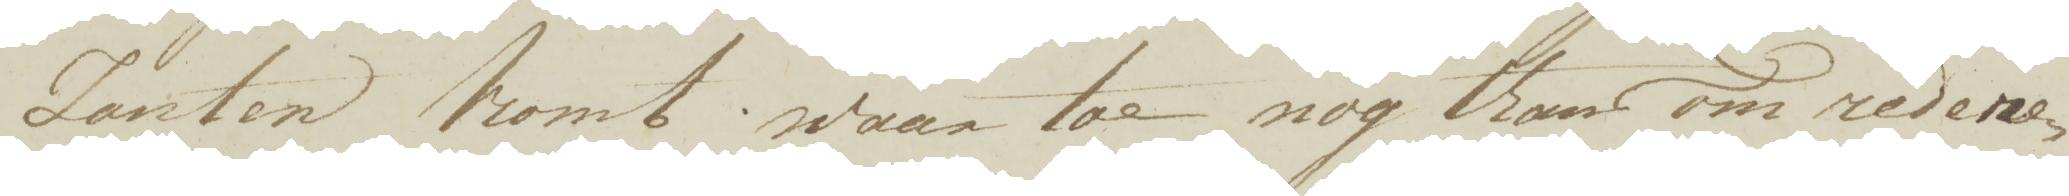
zanten komt waar toe nog thans om redenen
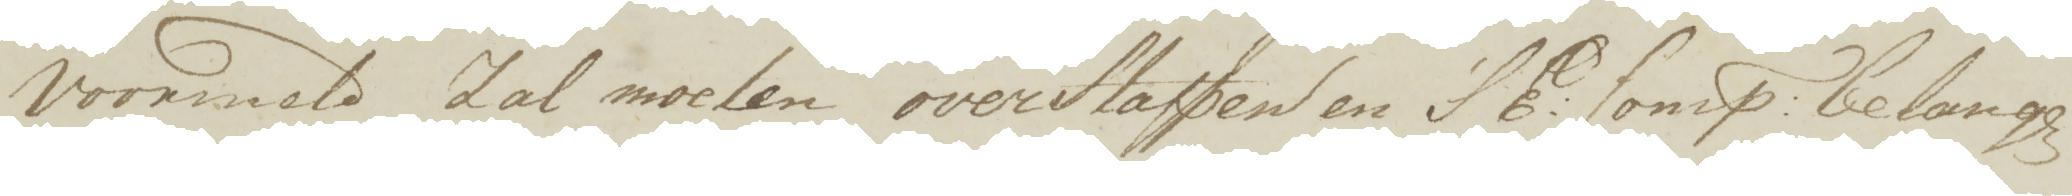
voormeld zal moeten overstappen en ’s E: Comp: belangen
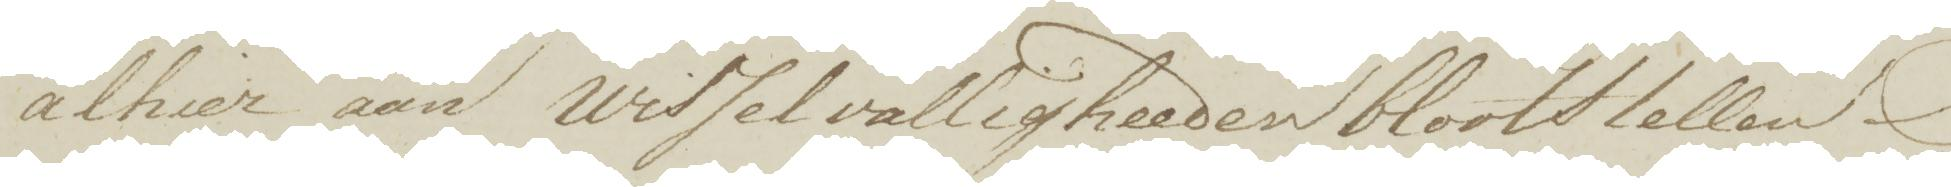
alhier aan wissel valligheeden blootstellen
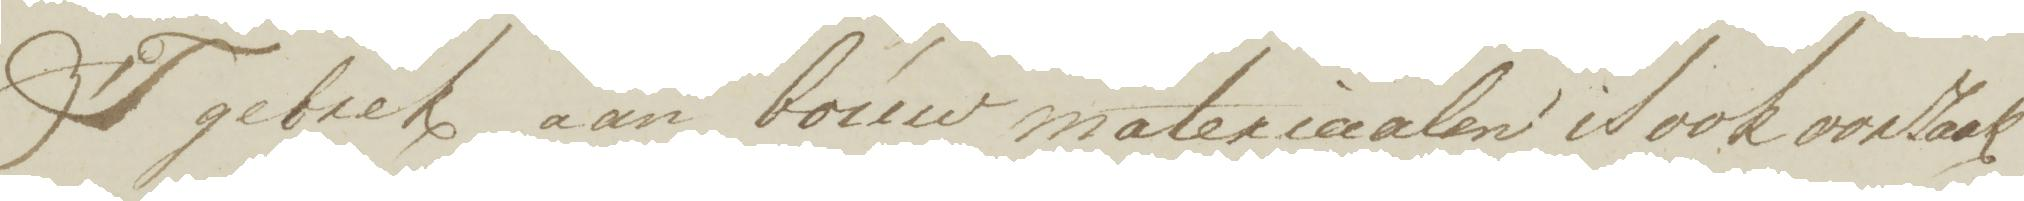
'T gebrek aan bouw materiaalen is ook oorzaak
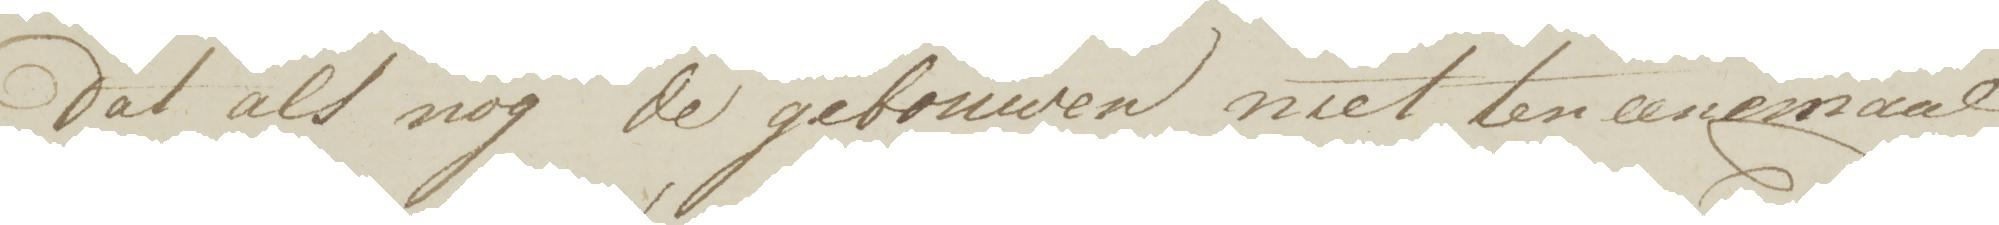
dat als nog de gebouwen niet ten eenemaal
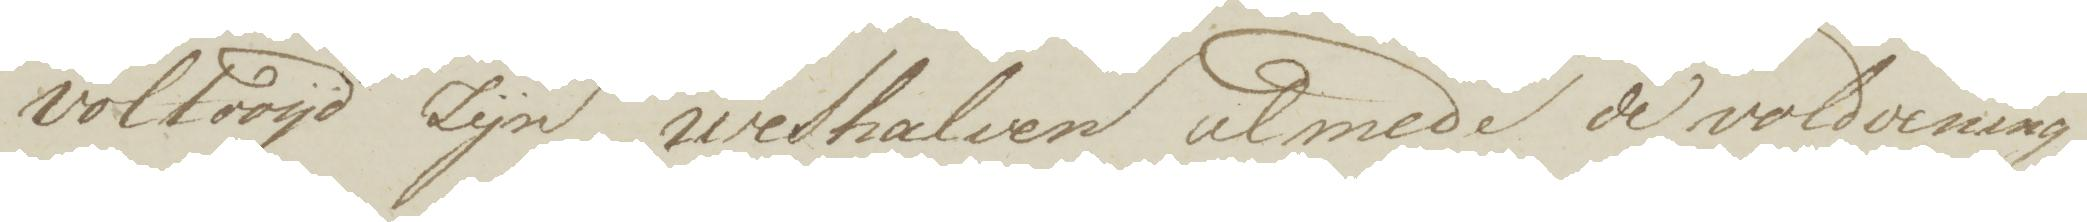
voltooijd zijn weshalven almede de voldoening
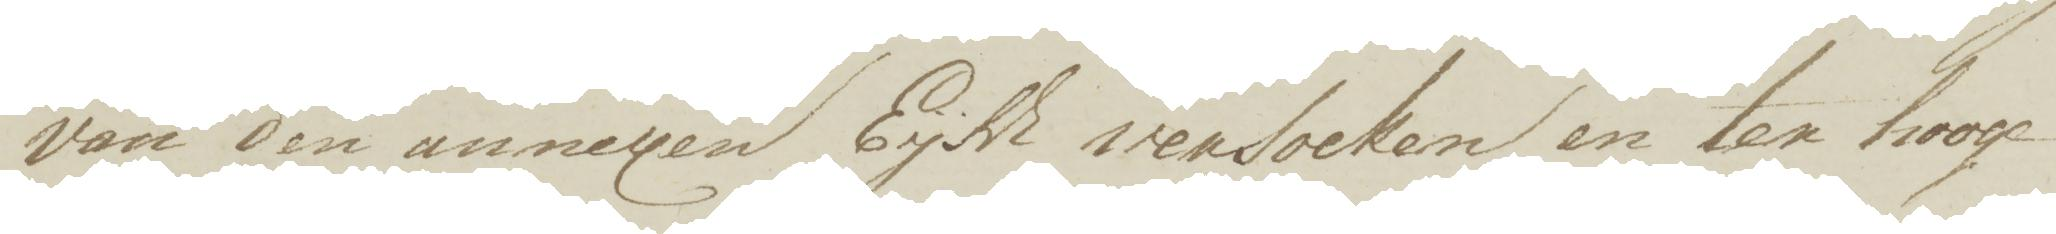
van den annexen Eijsch versoeken en ter hoog
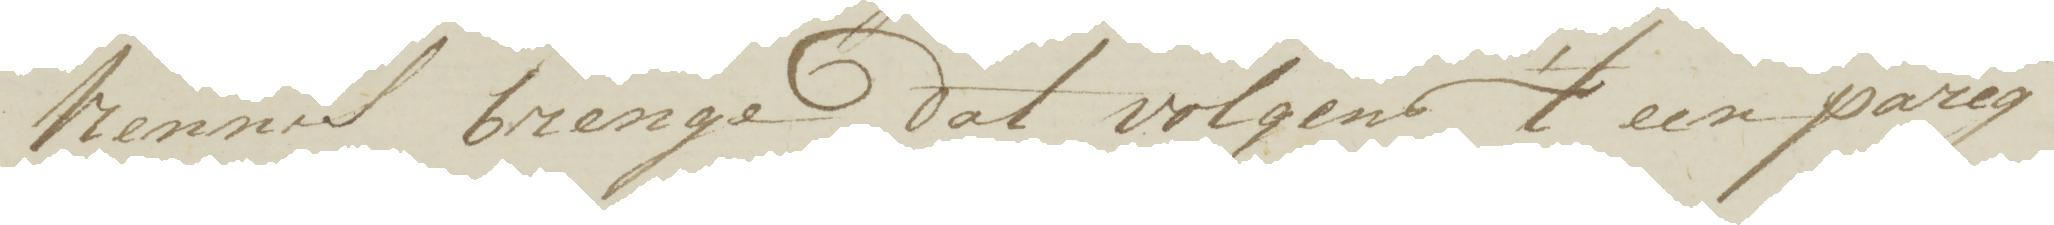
kennis brenge dat volgens 't een parig
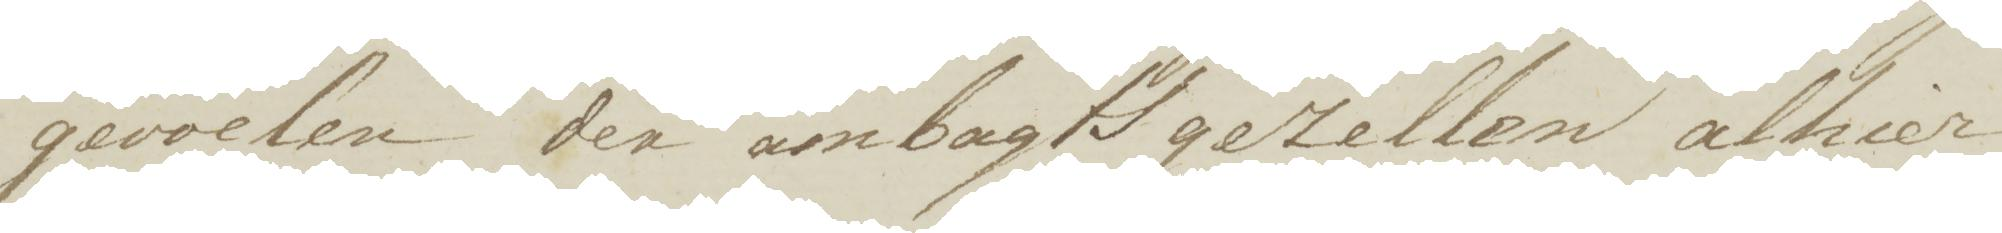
gevoelen der ambagts gezellen alhier
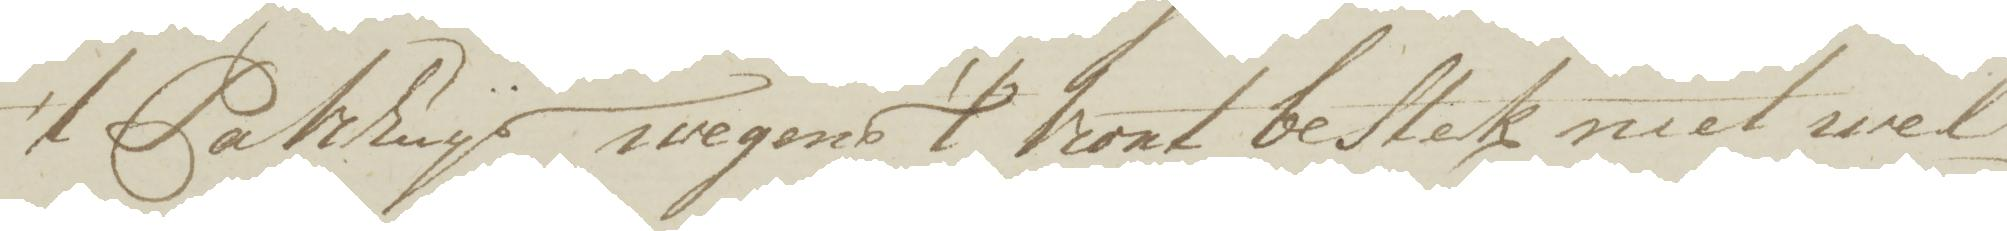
’t Pakhuijs wegens ’t kort bestek niet wel
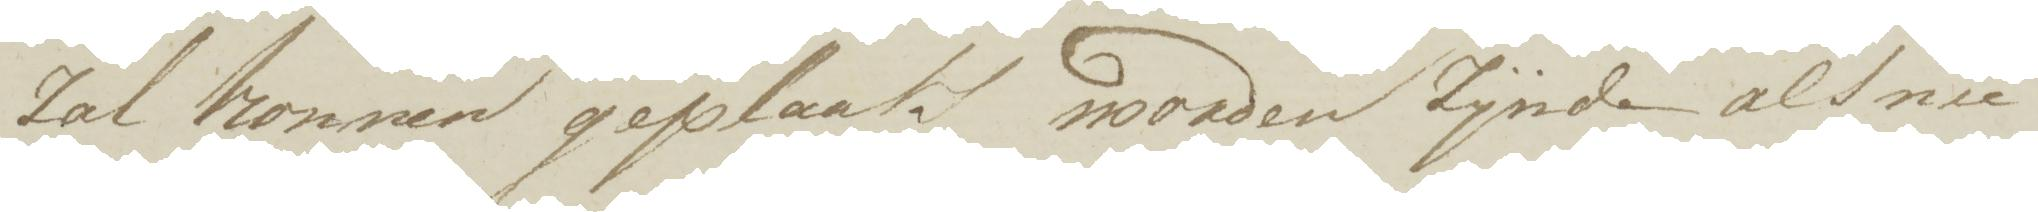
zal konnen geplaatst worden zijnde als nae
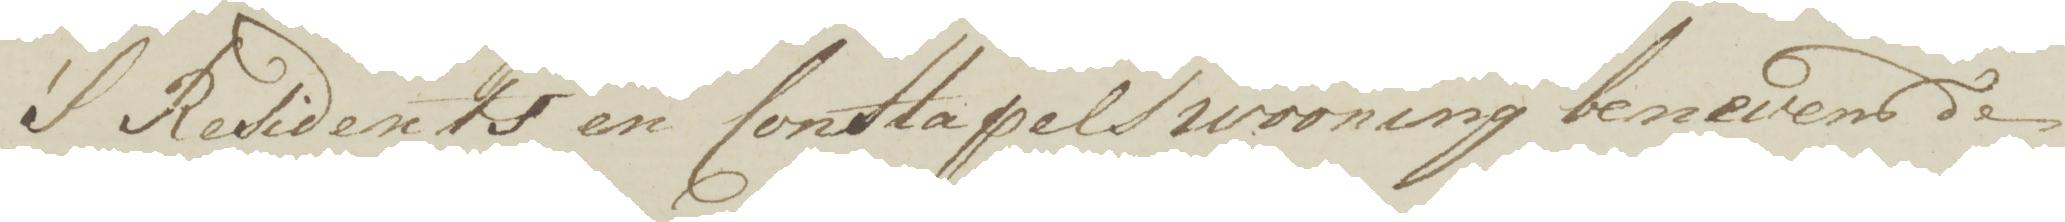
’s Residents en constapels wooning benevens de
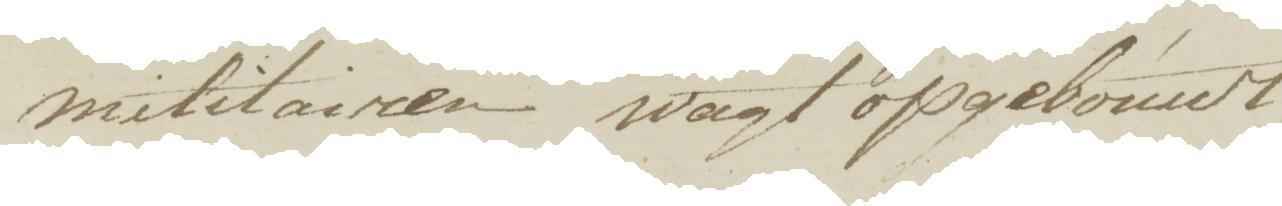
militairen wagt opgebouwt
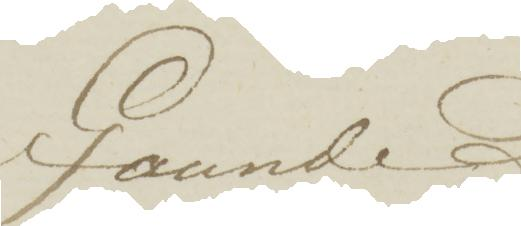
Gaande
